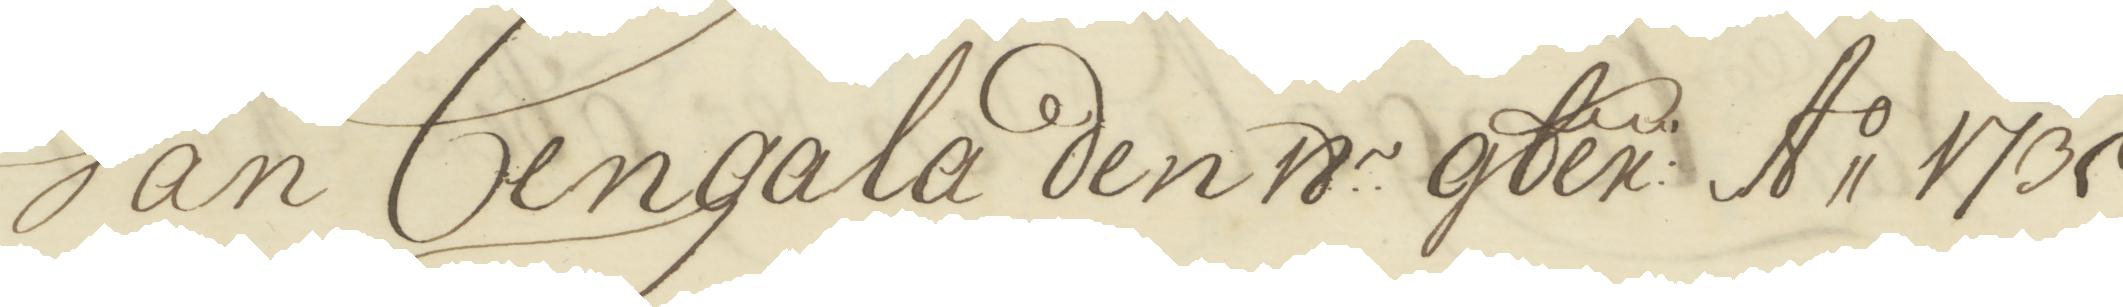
Van Bengala den 18:' 9ber: A„o 1735
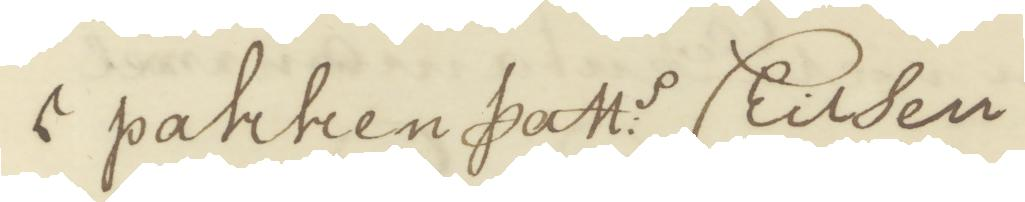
5 pakken patt:s Chitsen
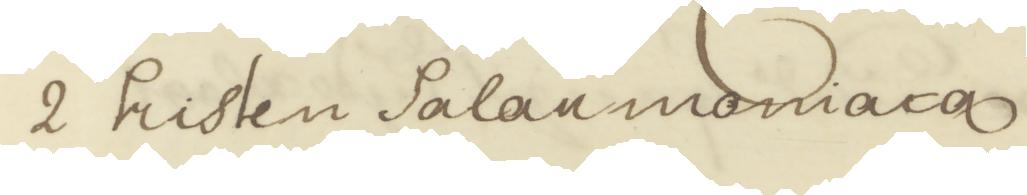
2 kisten Salarmoniacq
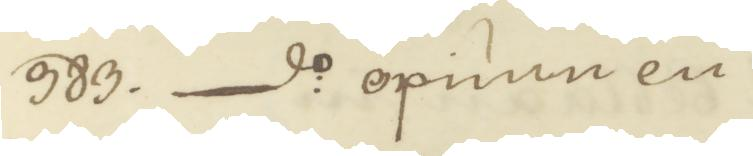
383. _:o opium en
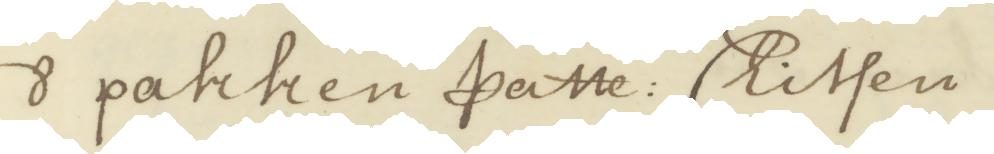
8 pakken patte: Chitsen
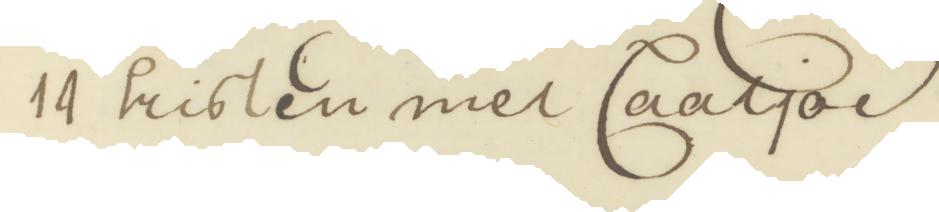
14 kisten met Caatjoel
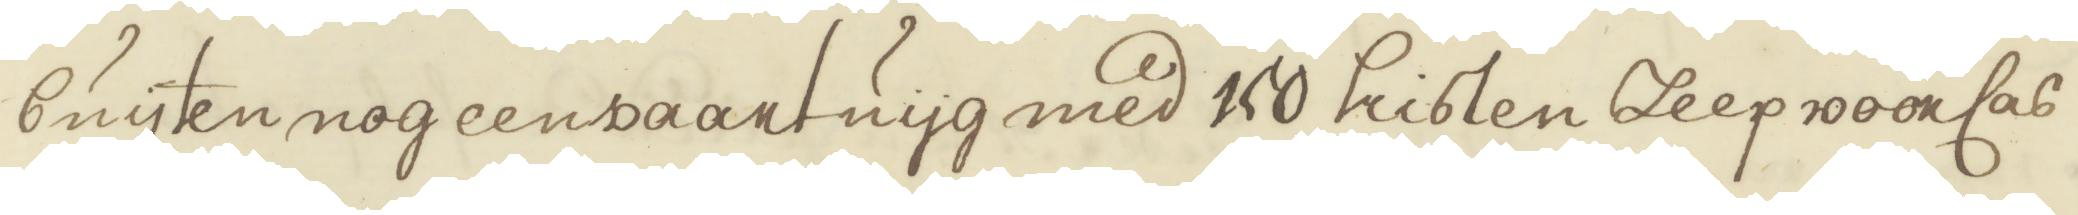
buijten nog een vaartuijg med 150 kisten zeep voor Cas
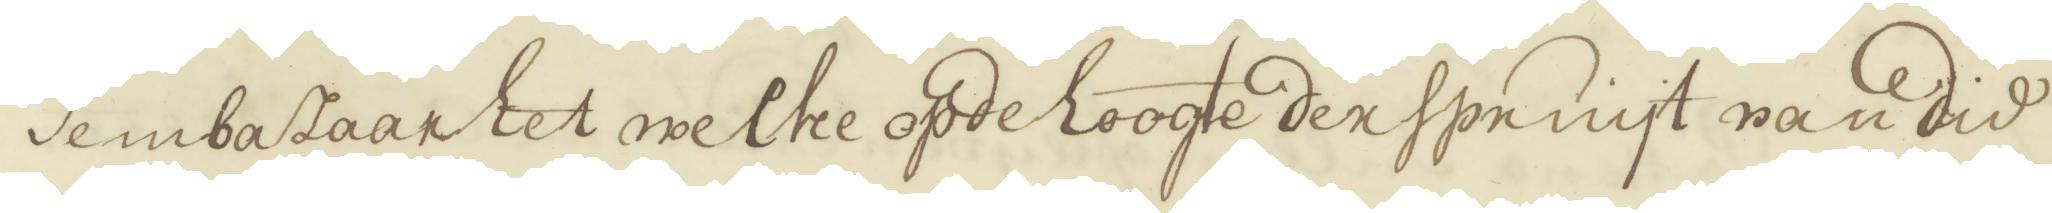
Sembazaar het welke op de hoogte der spruijt van die
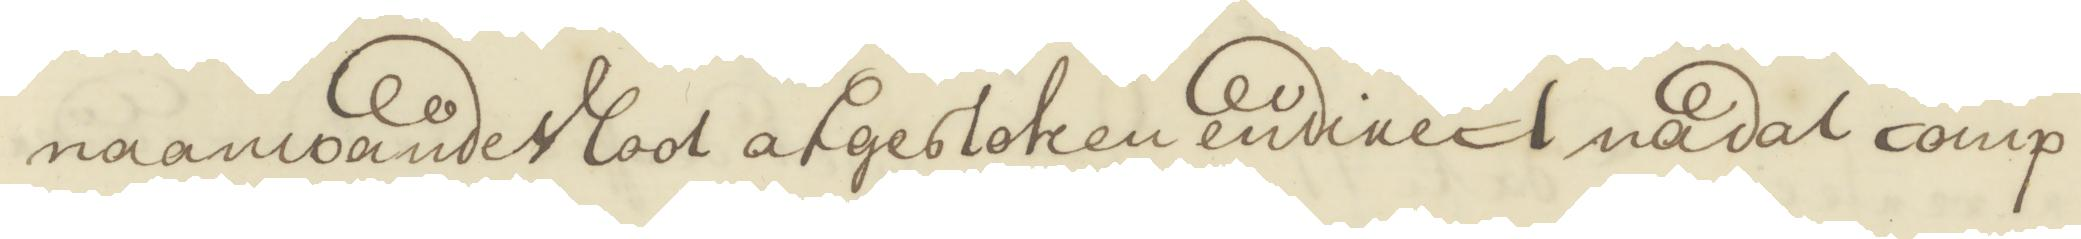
naam vande vloot afgestoken en direct na dat comp
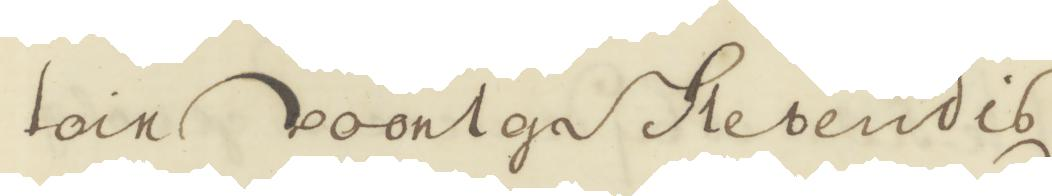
toir voortgestevend is
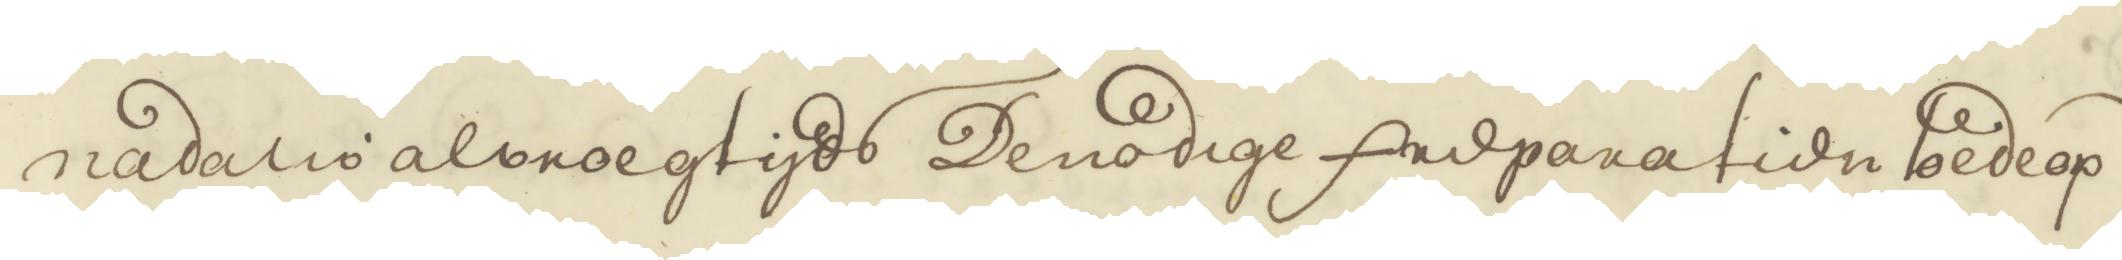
nadat w' al vroegtijds De nodige preparatien toe de op
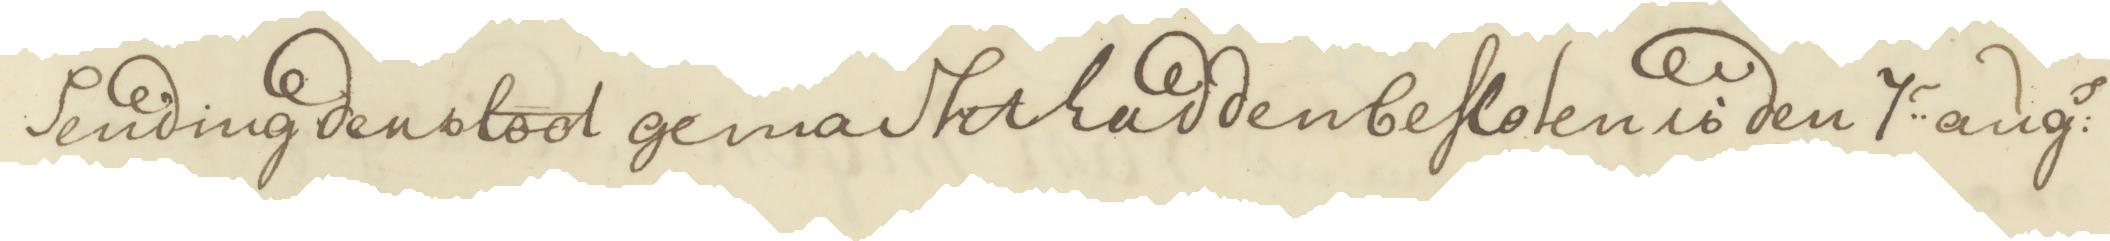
sending der vloot gemaekt hadden besloten is den 7:' aug:s
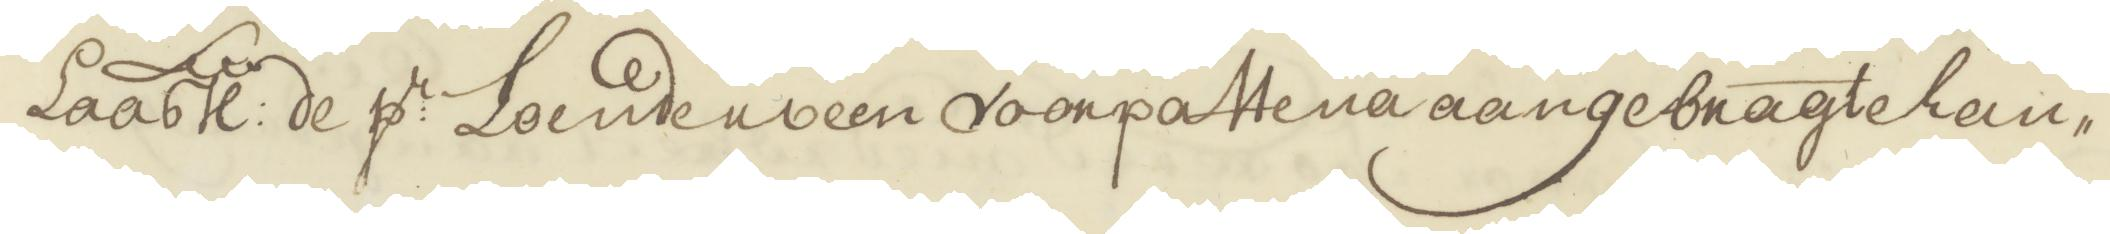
Laastl: de p:r Loenderveen voor pattena aangebragte han„
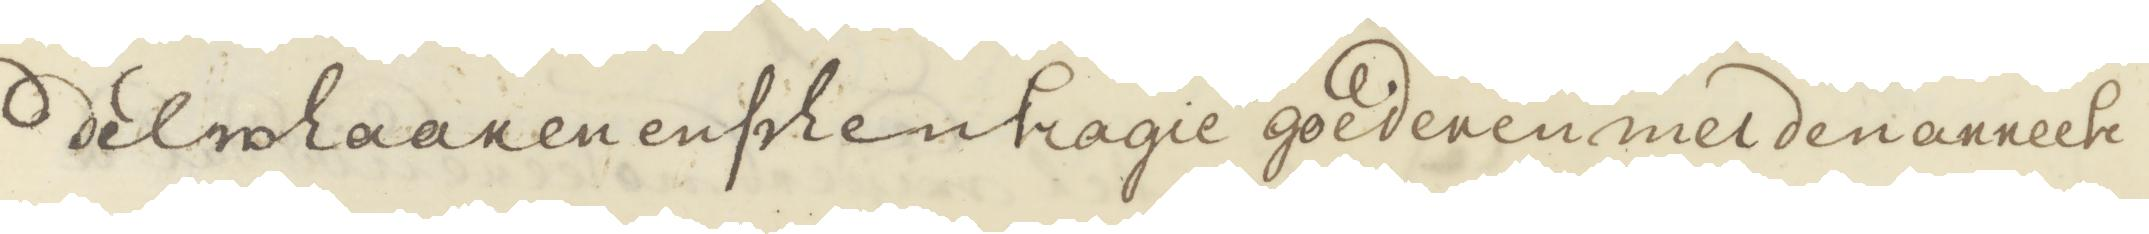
delwhaaren en schenkagie goederen met den arreek
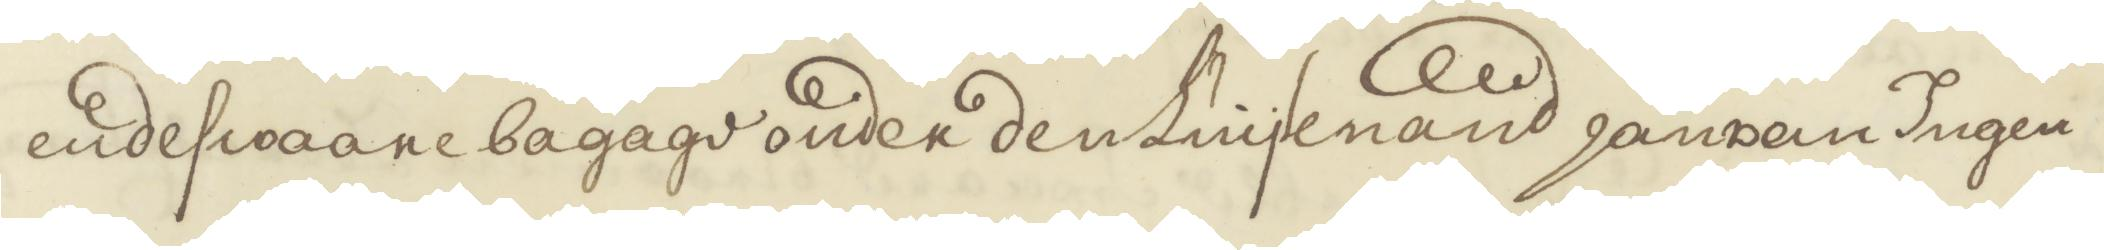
ende swaare bagage onder den Luijtenand jan van Ingen
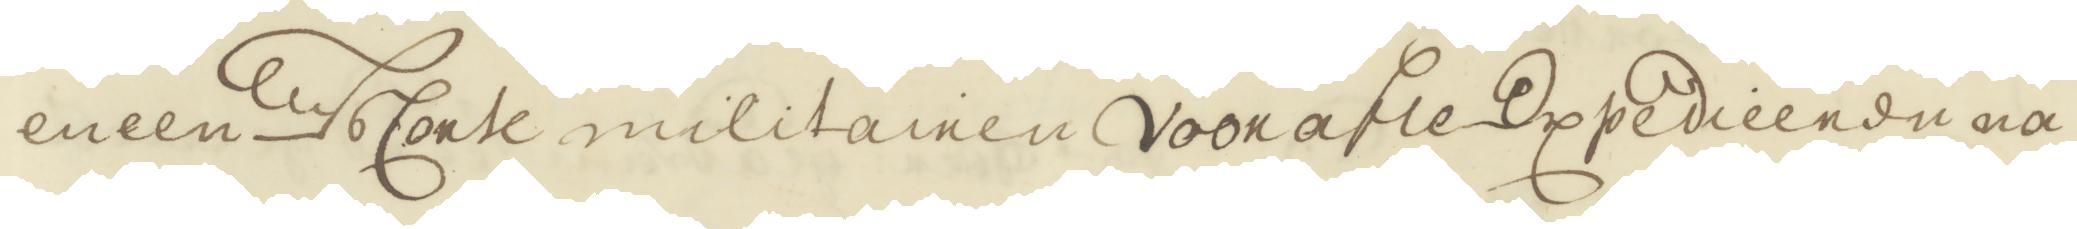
en een Escorte militairen vooraf te Expedieeren na
